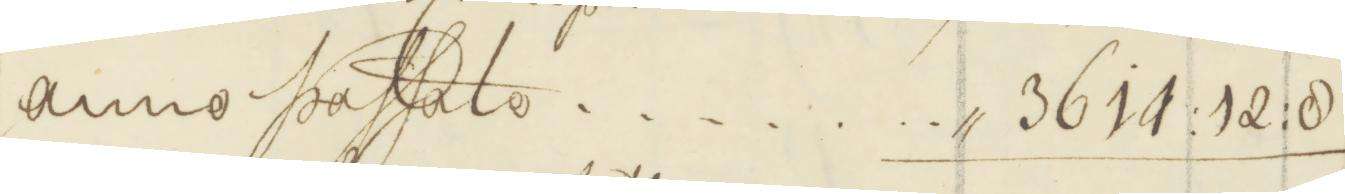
anno passato - - - - - - - „ 3614: 12: 8
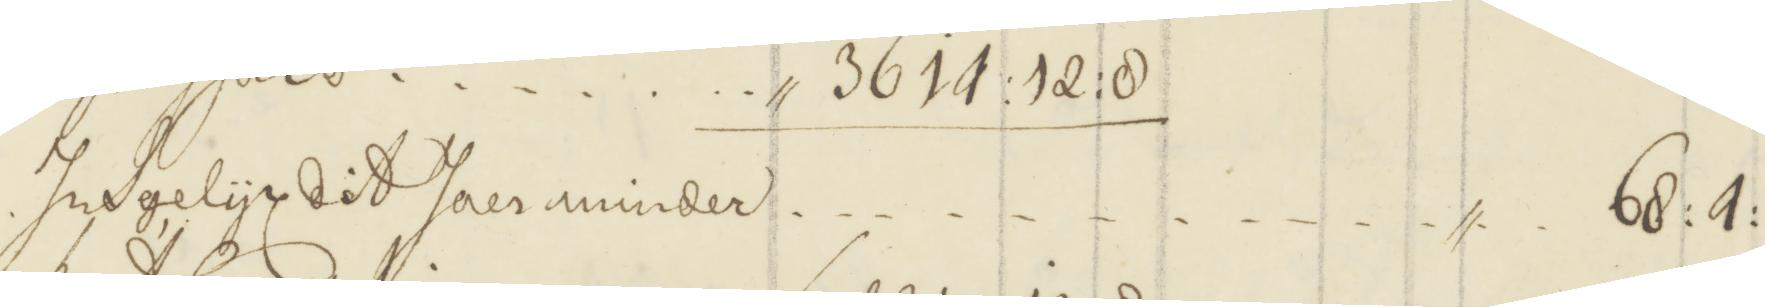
Jnsgelijx dit Jaer minder - - - - - - - - - - - „ 68: 4:
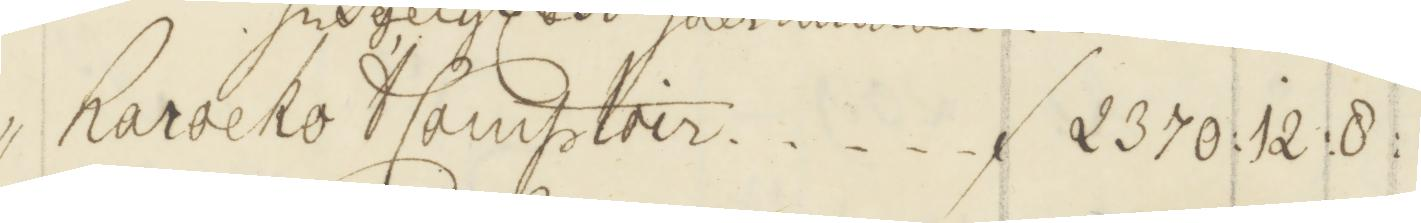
„ haroeko 'tComptoir - - - - - ƒ 2370: 12 :8 :
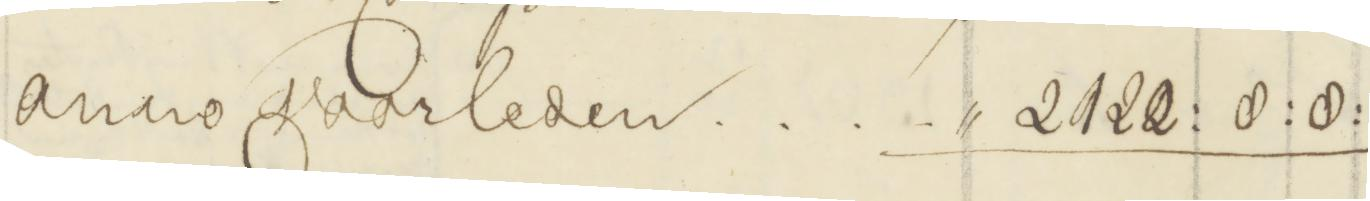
anno voorleden - - - - „ 2422: 8: 8
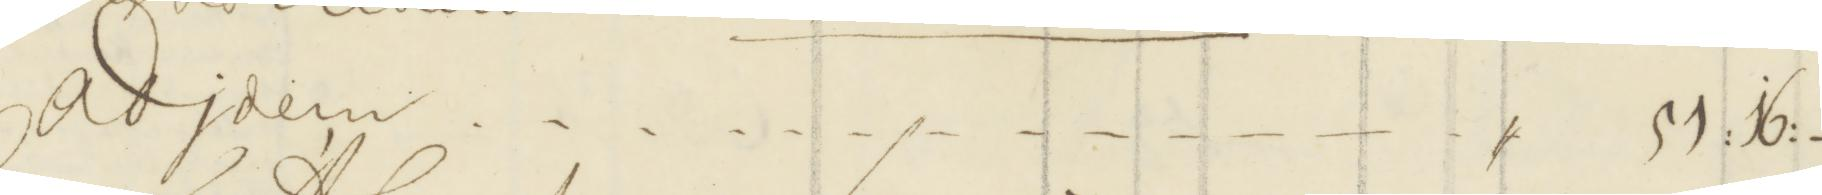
adjdem - - - - - - - - - - - - - „ 51: 16: —
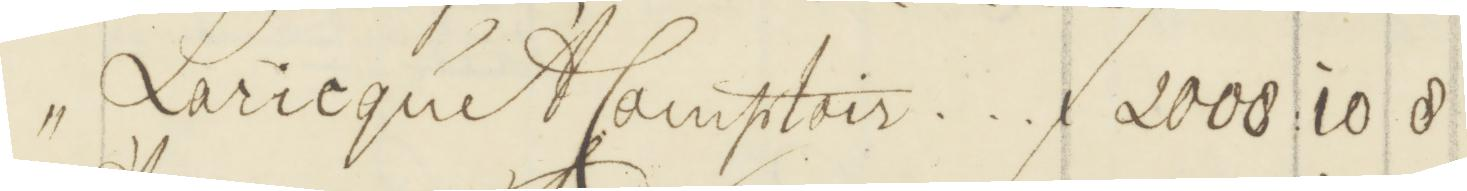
„ Laricque 'tComptoir - - - ƒ 2008: 10 8
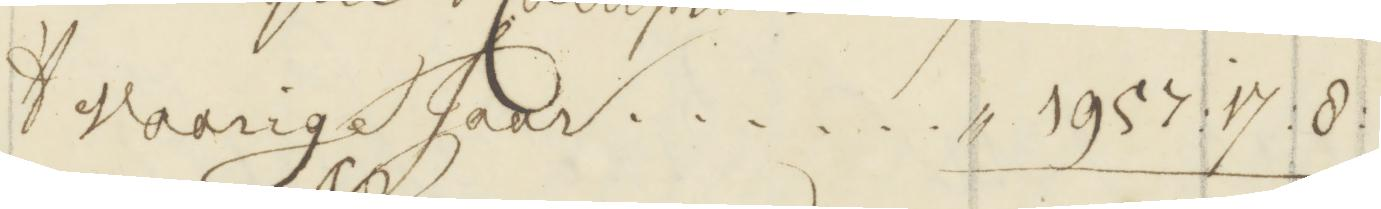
't voorige Jaar - - - - - - „ 1957: 17: 8
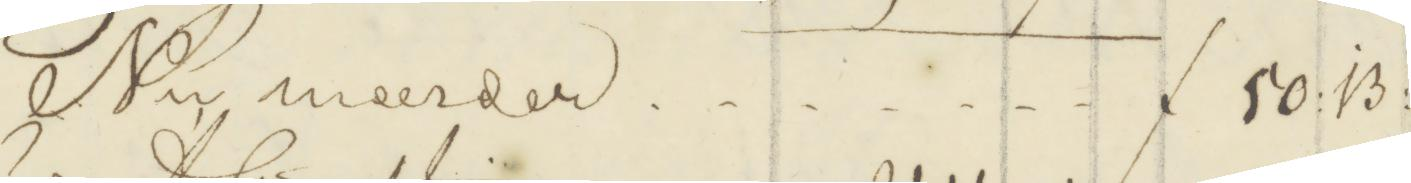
Nu meerder - - - - - - - ƒ 50: 13
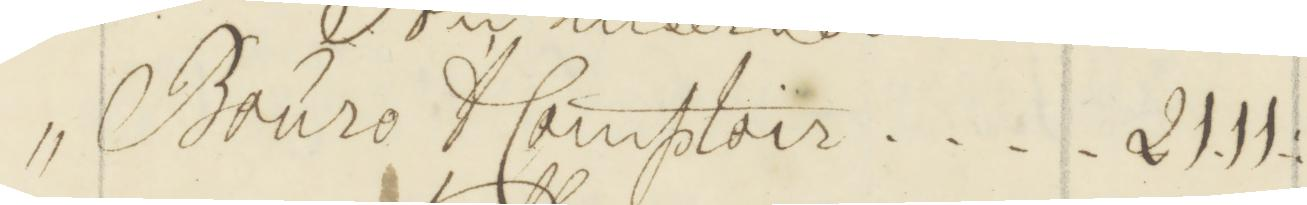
„ Bouro 'tComptoir - - - - 21.11.
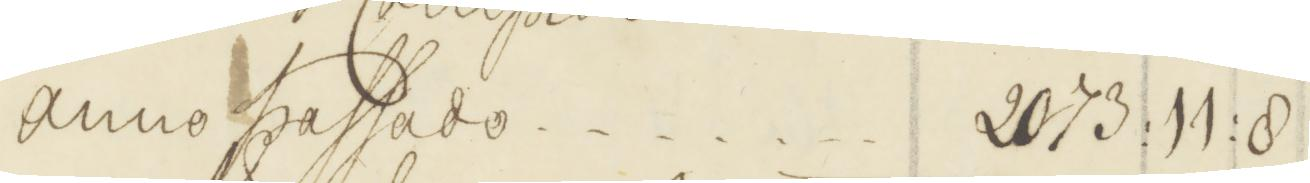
anno passado - - - - - - - 2073:11:8
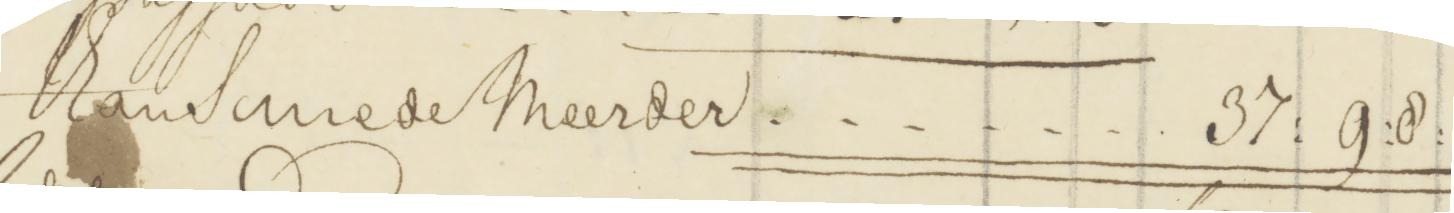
thans mede Meerder - - - - - - .37: 9 :8
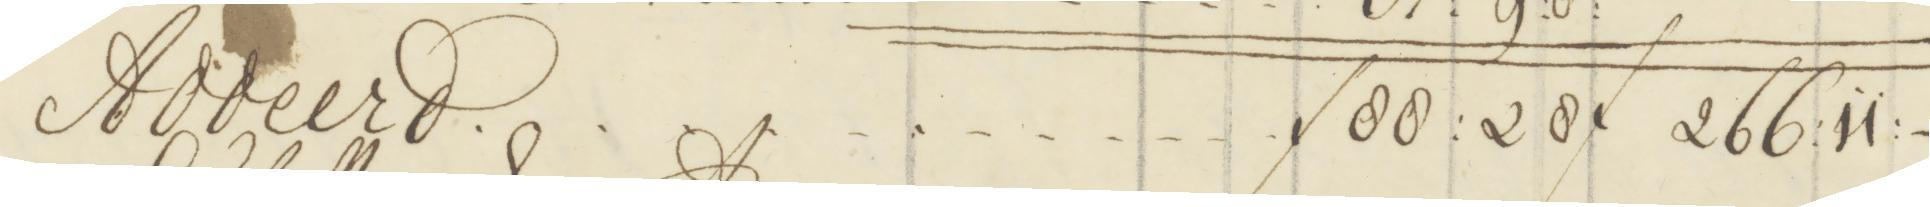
Addeerd - - - - - - - - - - - - ƒ 88 : 2 8 ƒ 266:11:
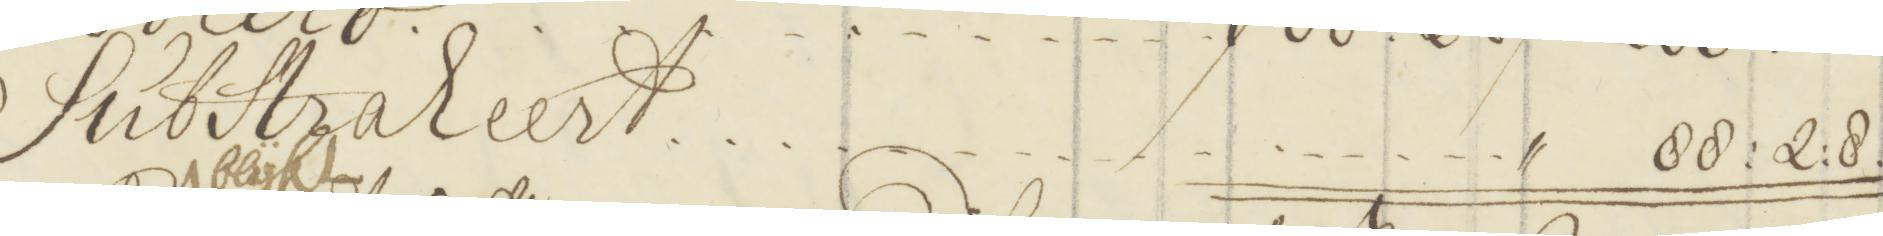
Substraheert - - - - - - - - - - - - - - - „ 88: 2:8
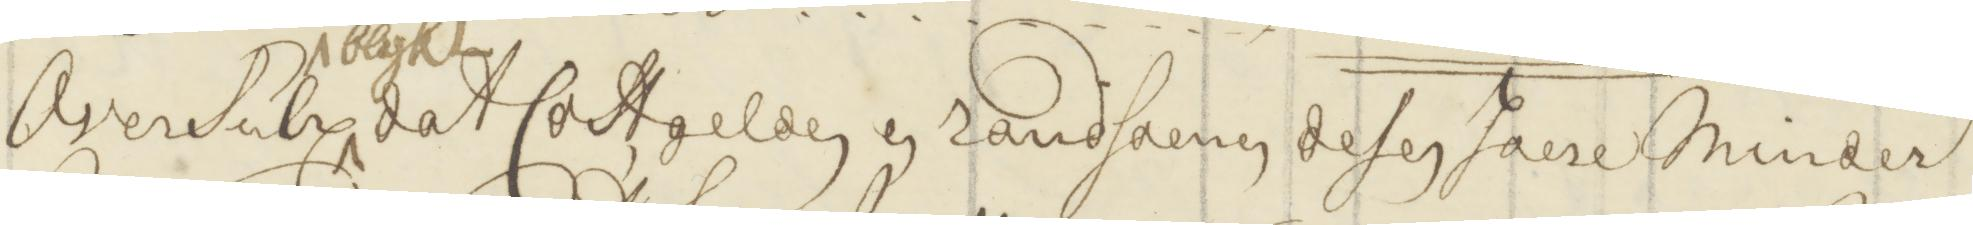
Oversulx ^ dat Costgelden en randsoenen desen Jaere Minder
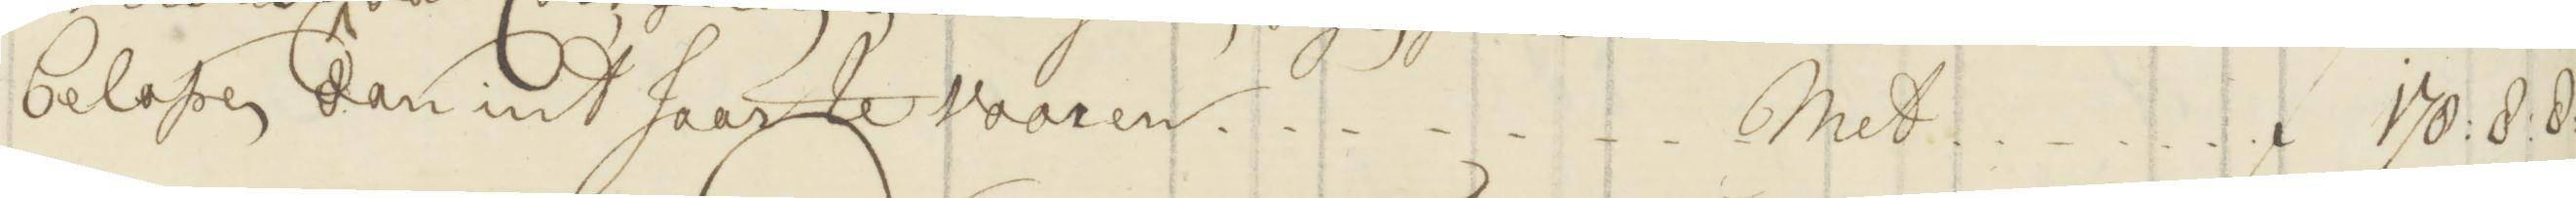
belopen dan in't Jaar te vooren - - - - - - - Met - - - - - - - ƒ 178: 8: 8
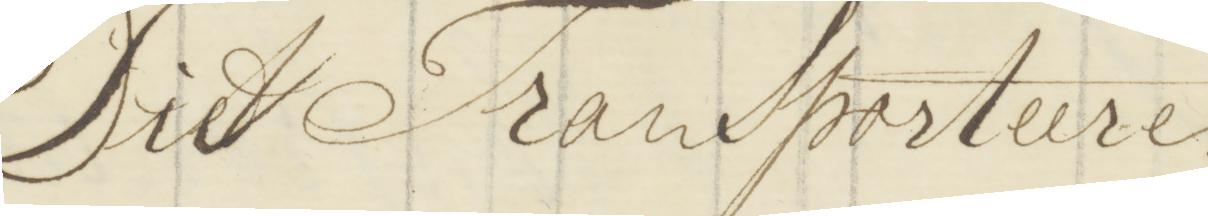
Die Transporteere
